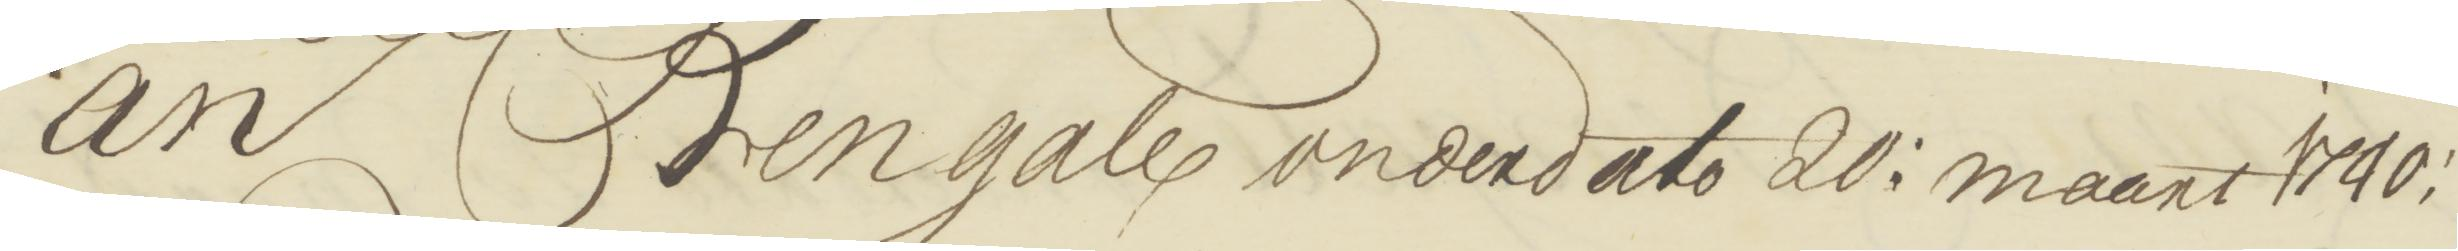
Van Bengale onderdato 20: maart 1740:
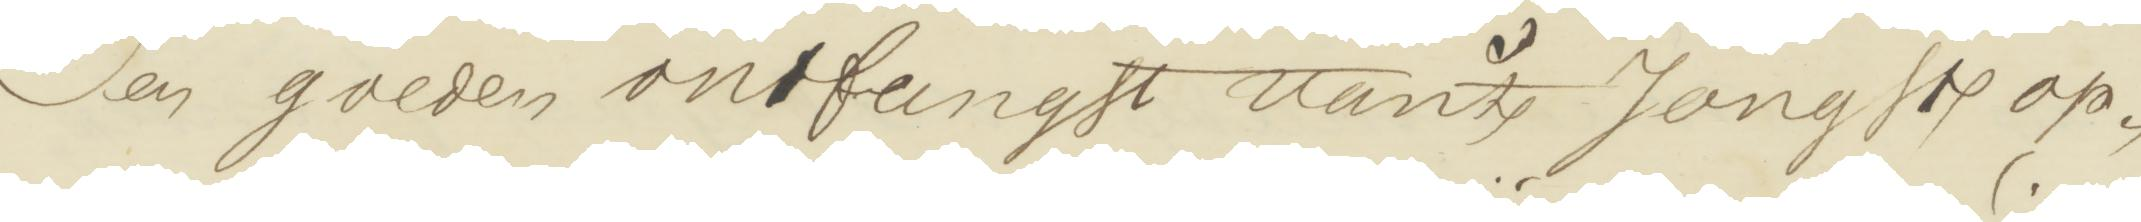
Den goeden ontfangst van't Jongste op
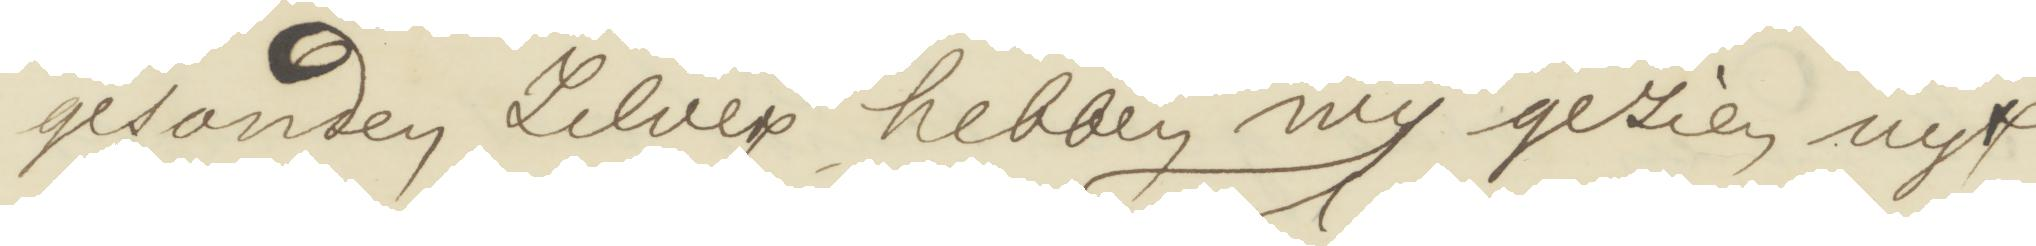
gesonden zilver hebben wij gezien uijt
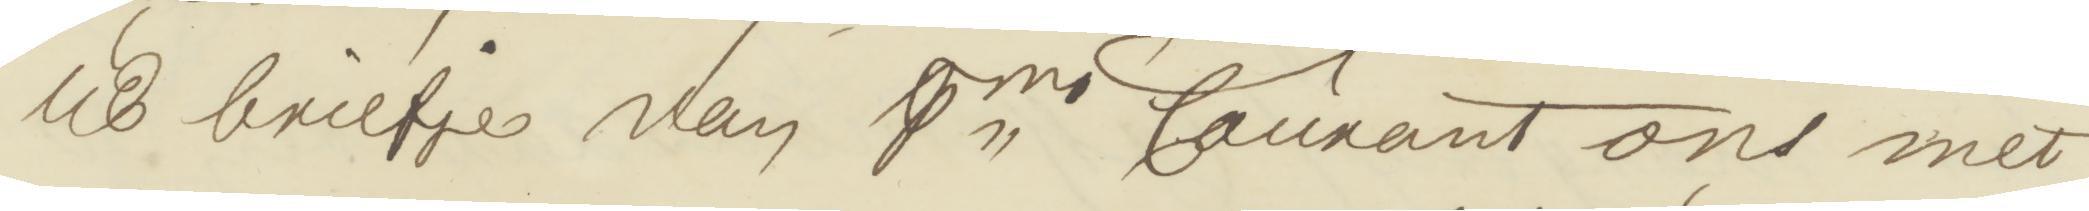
uE briefje van p„m Courant ons met
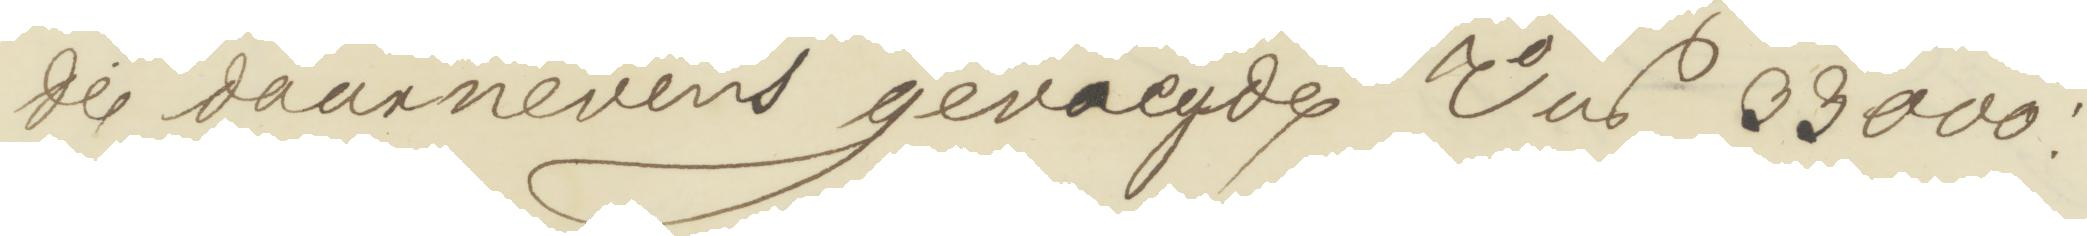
de daarnevens gevoegde roas 33000:
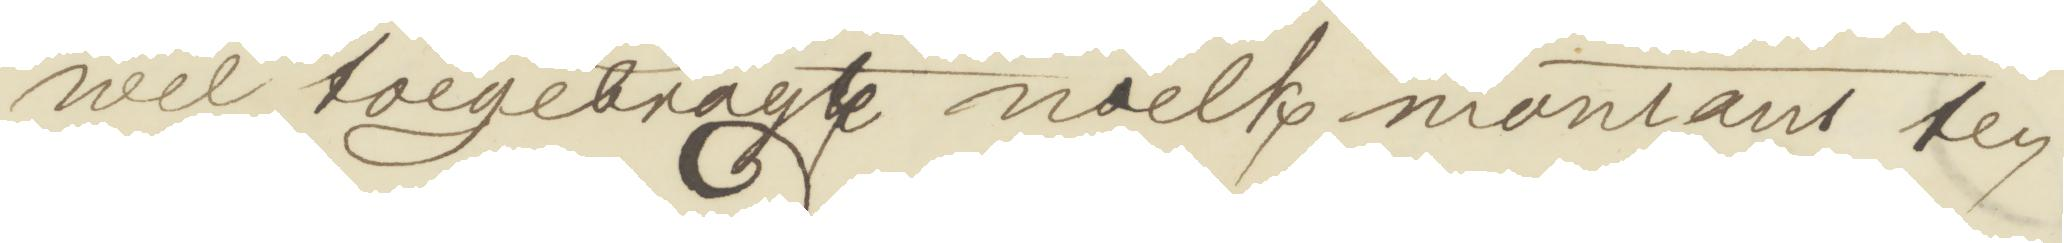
wel toegebragte welk montant ten
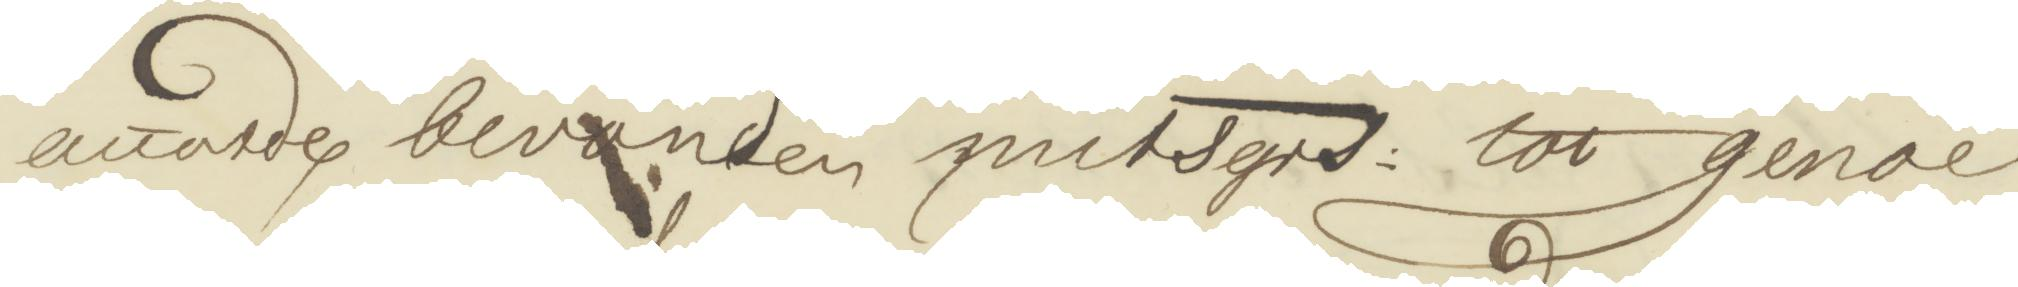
accorde bevonden mitsgrs: tot genoe
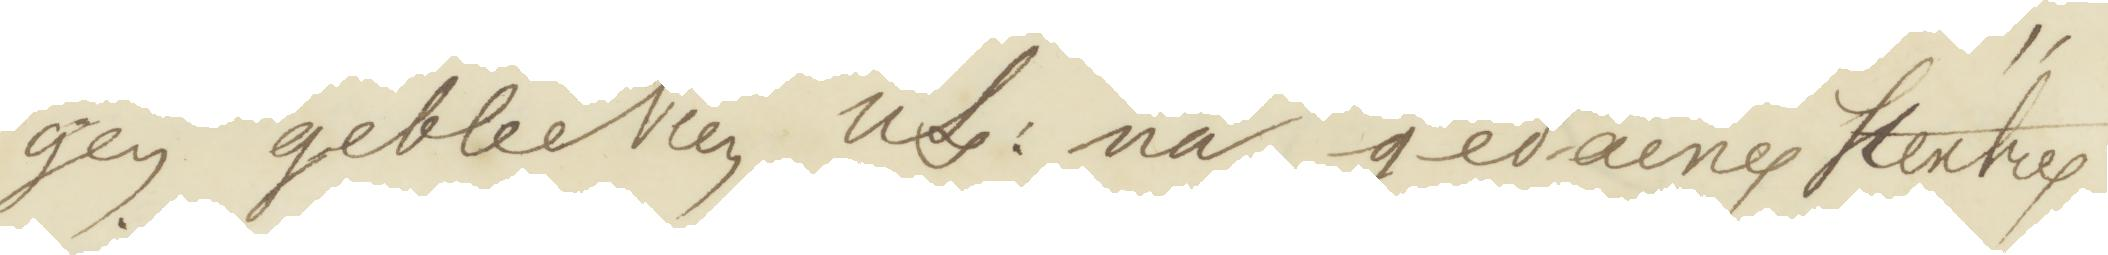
gen gebleeken uE: na gedaene sterke
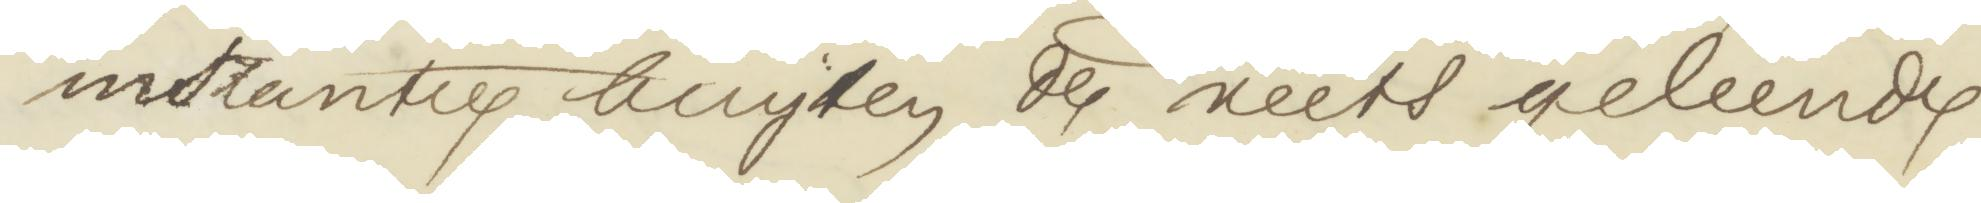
instantie buijten de reets geleende
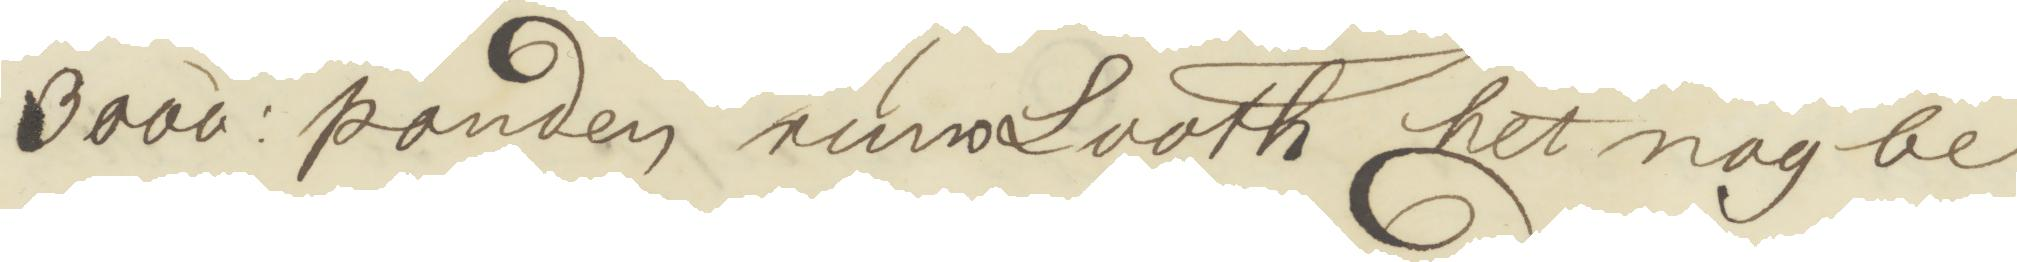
3000: ponden ruw Looth het nog be
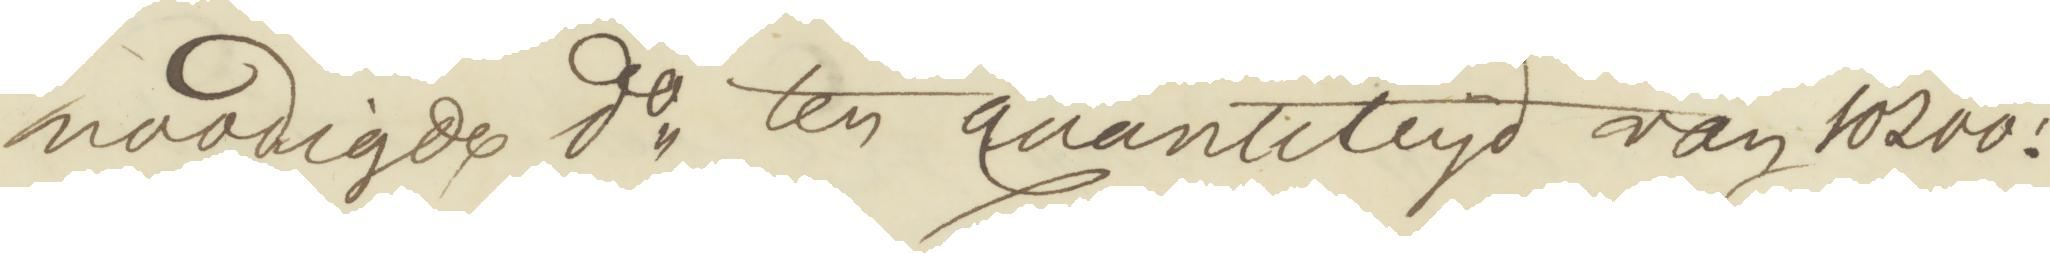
noodigde d„o ten quantiteijd van 10200:
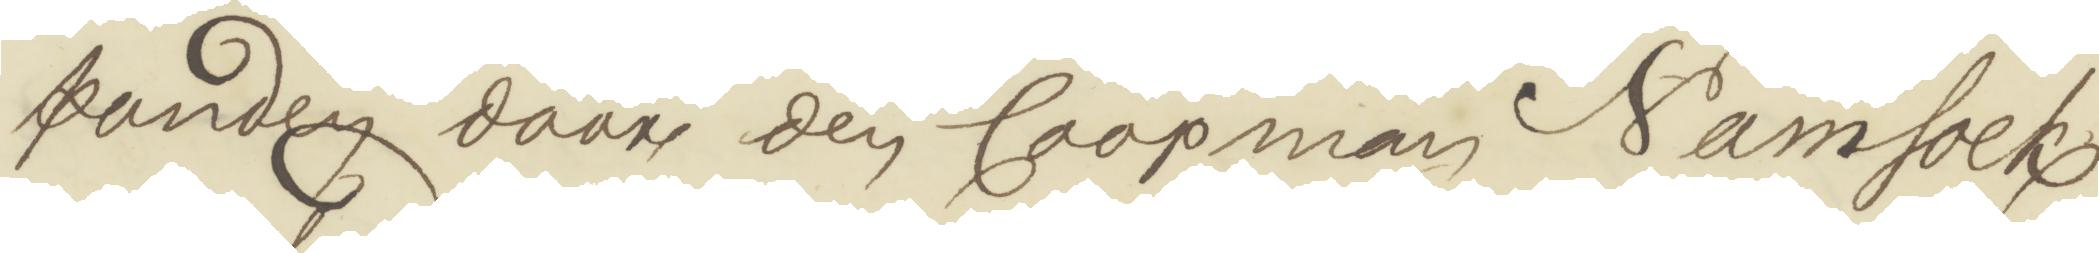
ponden door den Coopman Namsoek
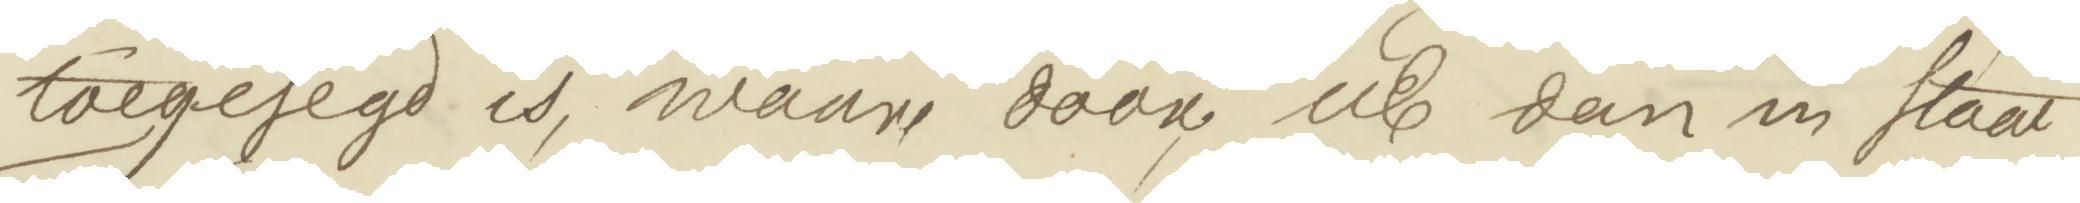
toegesegd is, waar door uE dan in staat
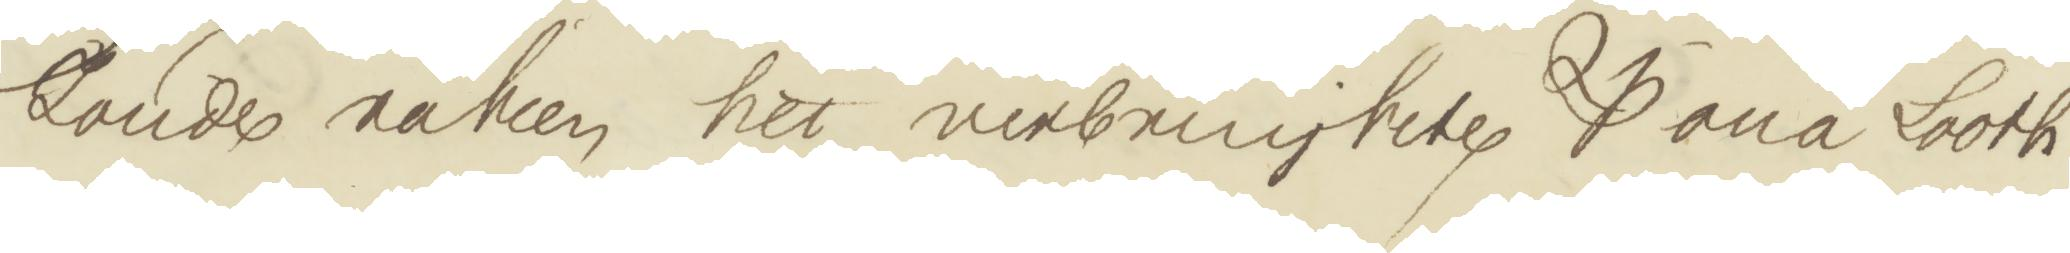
zoude raken het verbruijkte Pona Looth
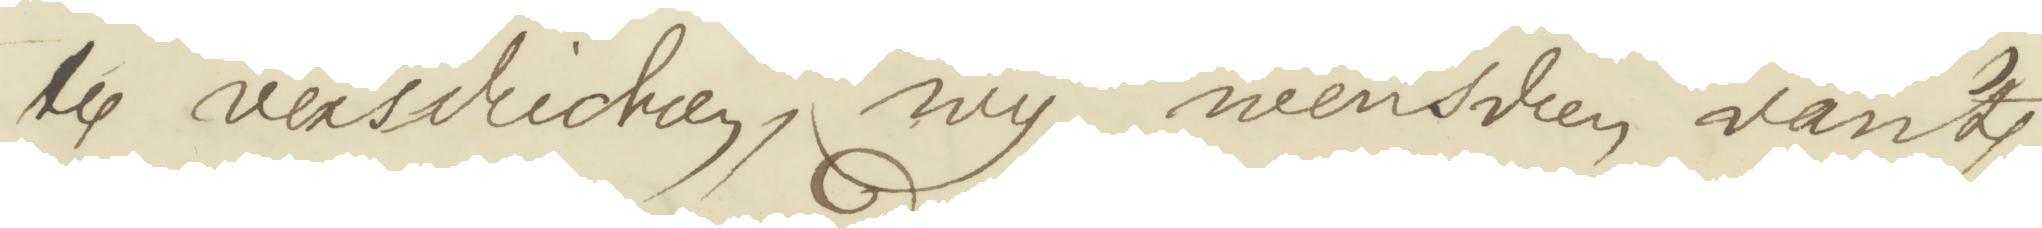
te verschicken, wij wenschen van 't
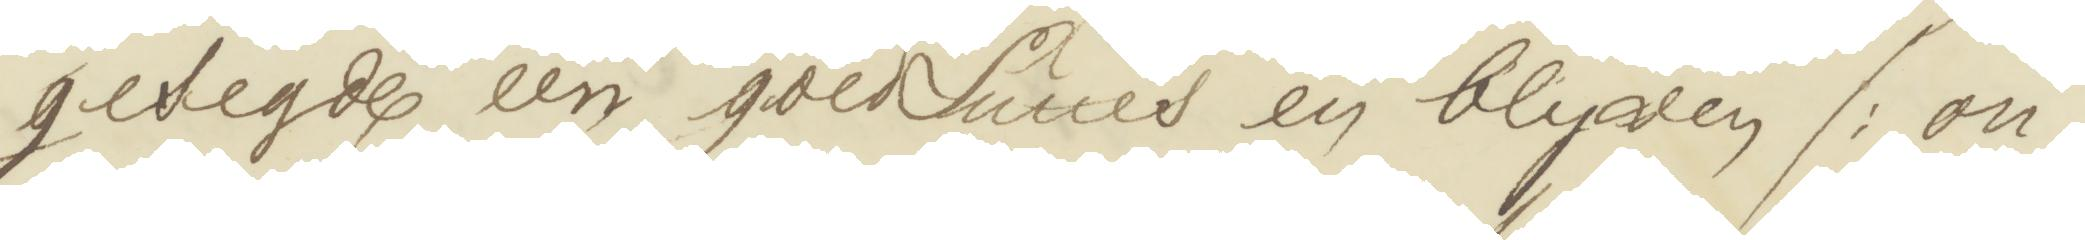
gesegde een goed succes en blijven /:on
